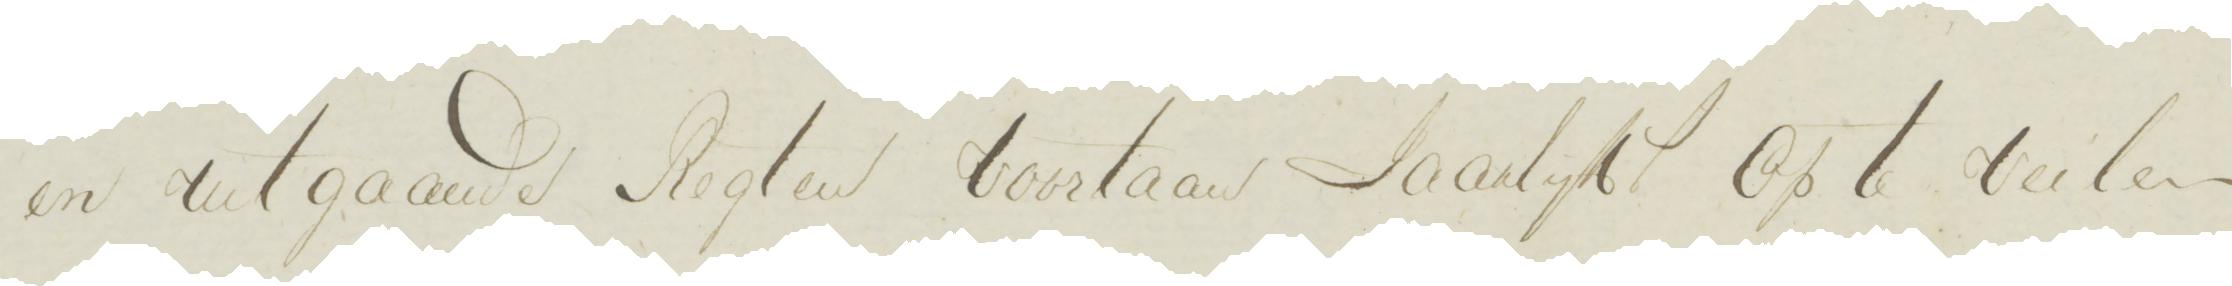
en uitgaande Regten voortaan Iaarlijks Op te veilen
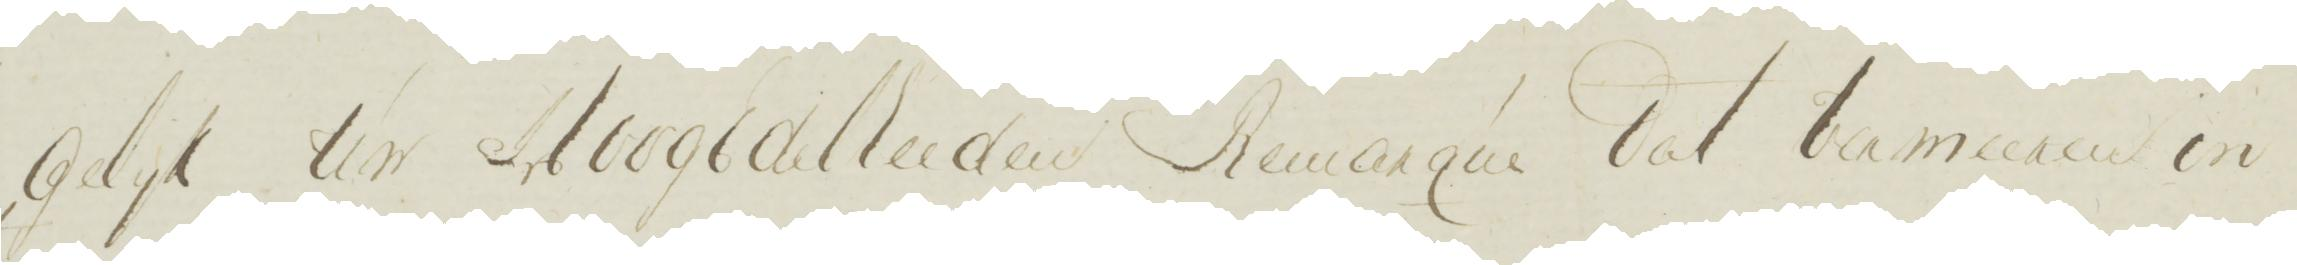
gelijk uw Hoog Edelheeden Remarque dat vermeeren in
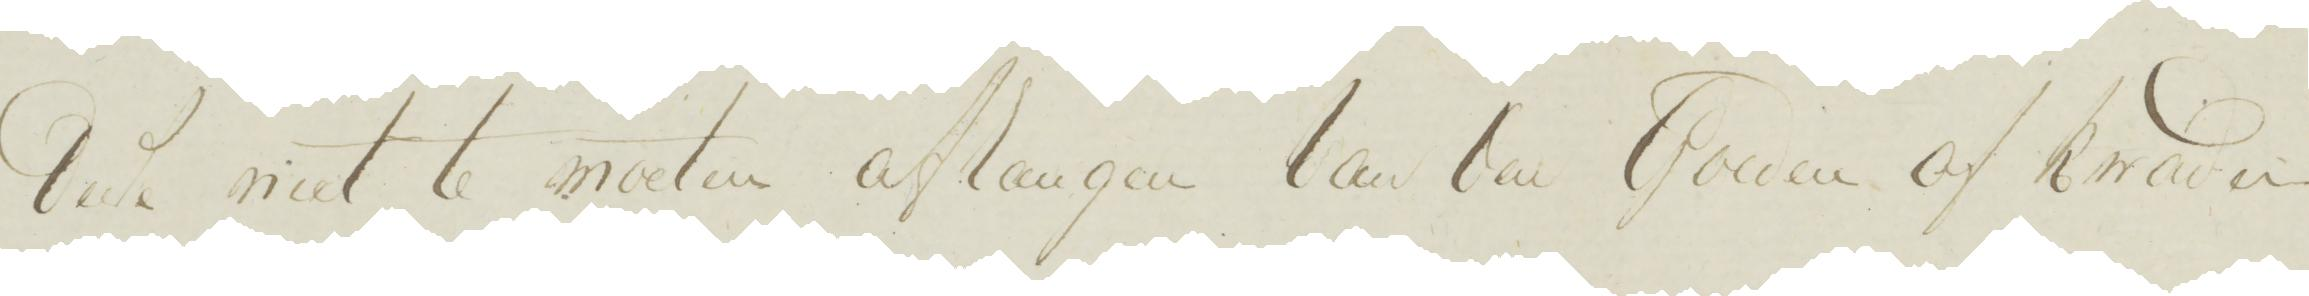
deese niet te moeten afhangen van den Goeden of kwaden
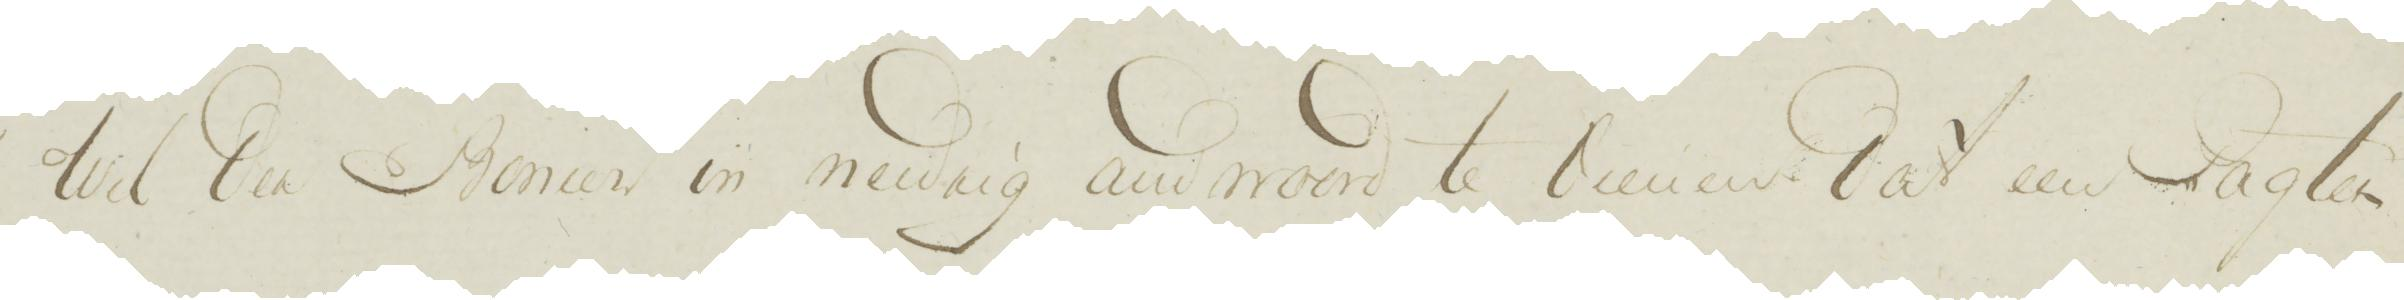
wil der Boniers in needrig andwoord te dienen dat een Pagter
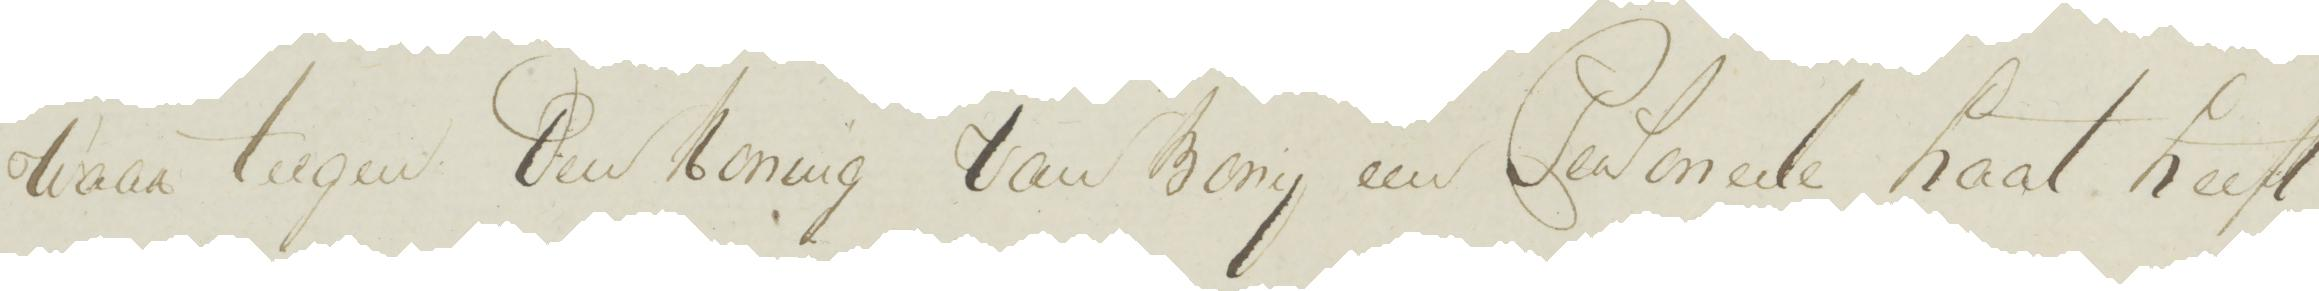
waar teegen den koning van Bonij een Personeele haat heeft
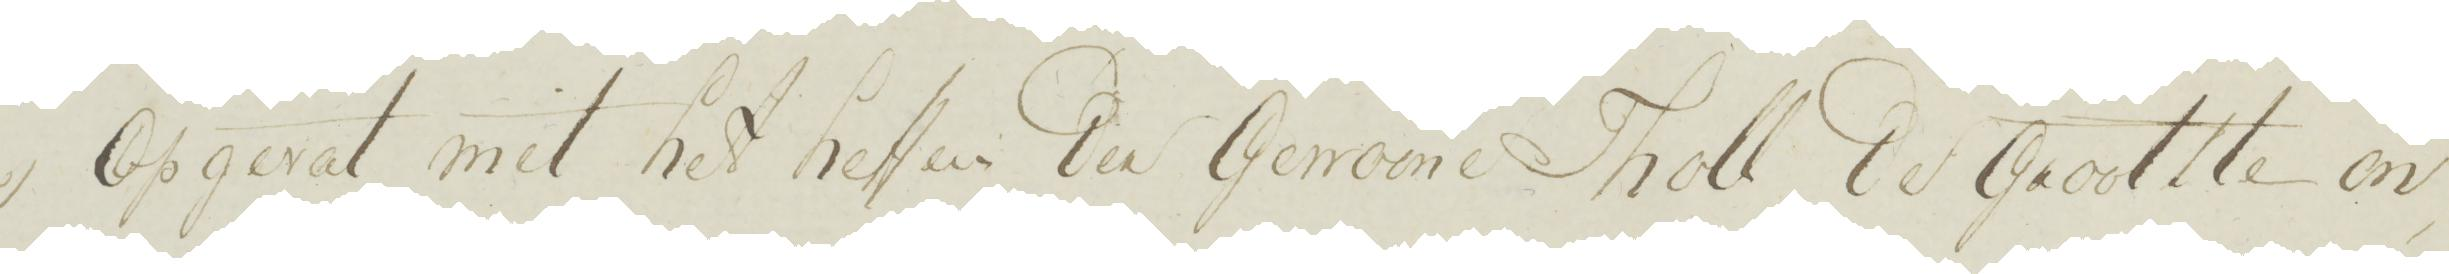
Opgevat met het heffen der Gewoone Tholl de Grootste on,
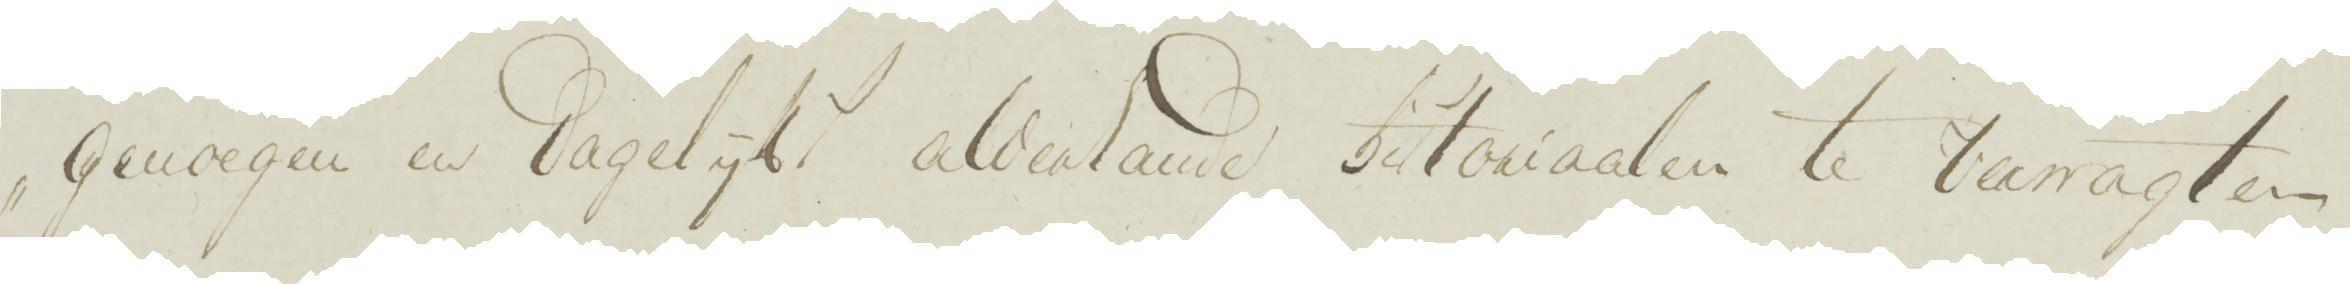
„genoegen en dagelijks alderhande historiaalen te verwagten
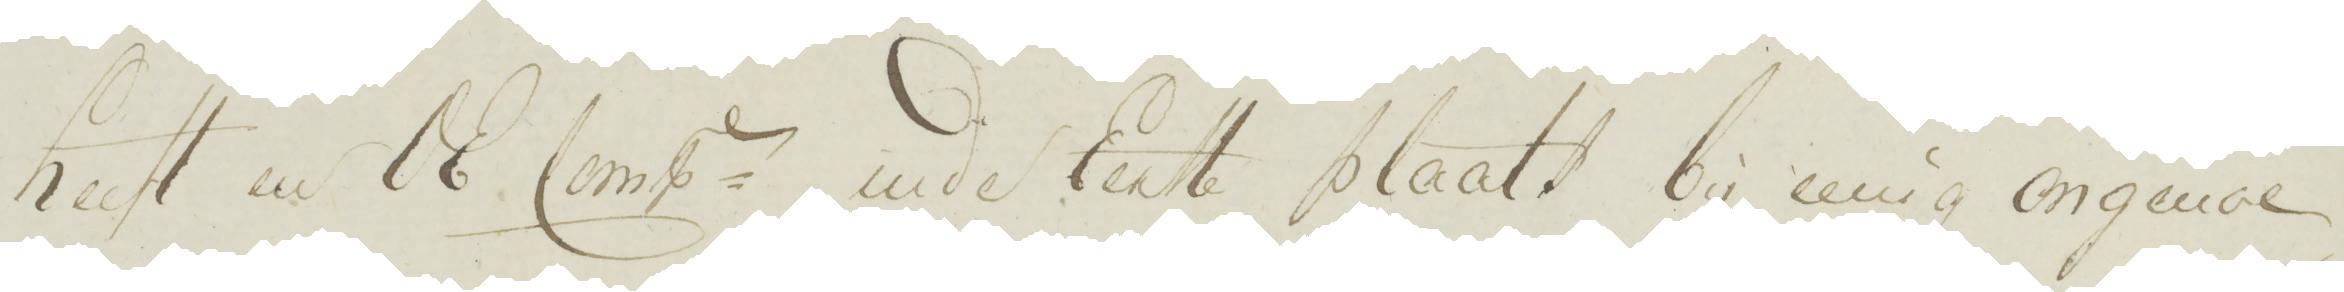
heeft en DE: Comp=e in de Eerste plaats bij eenig ongenoe„
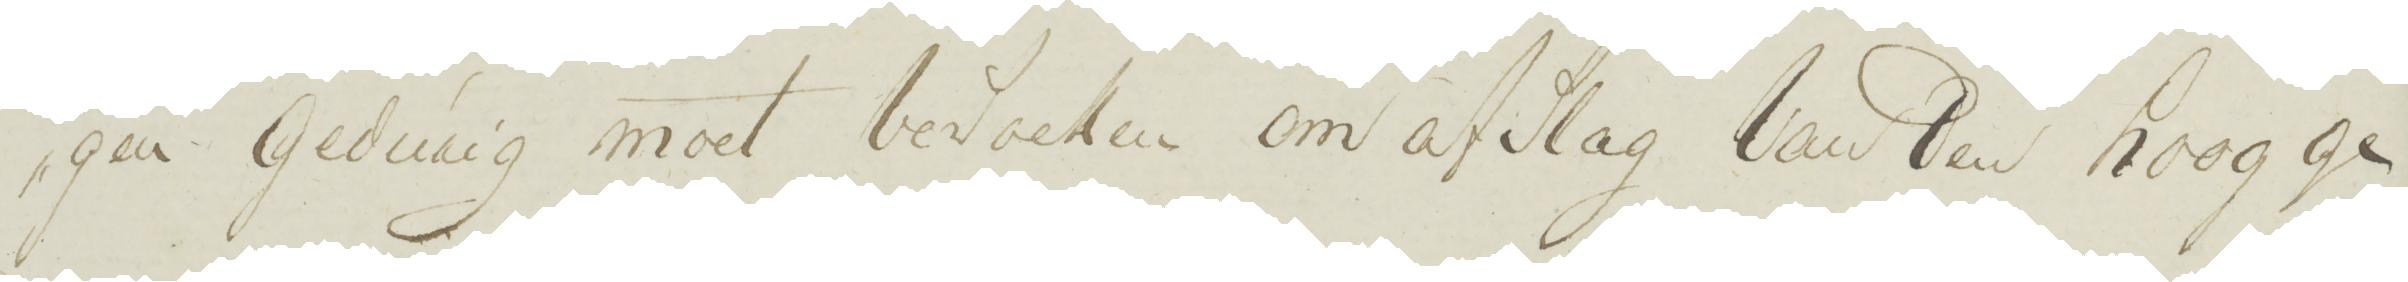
„gen gedurig moet versoeken om afslag van den hoog ge
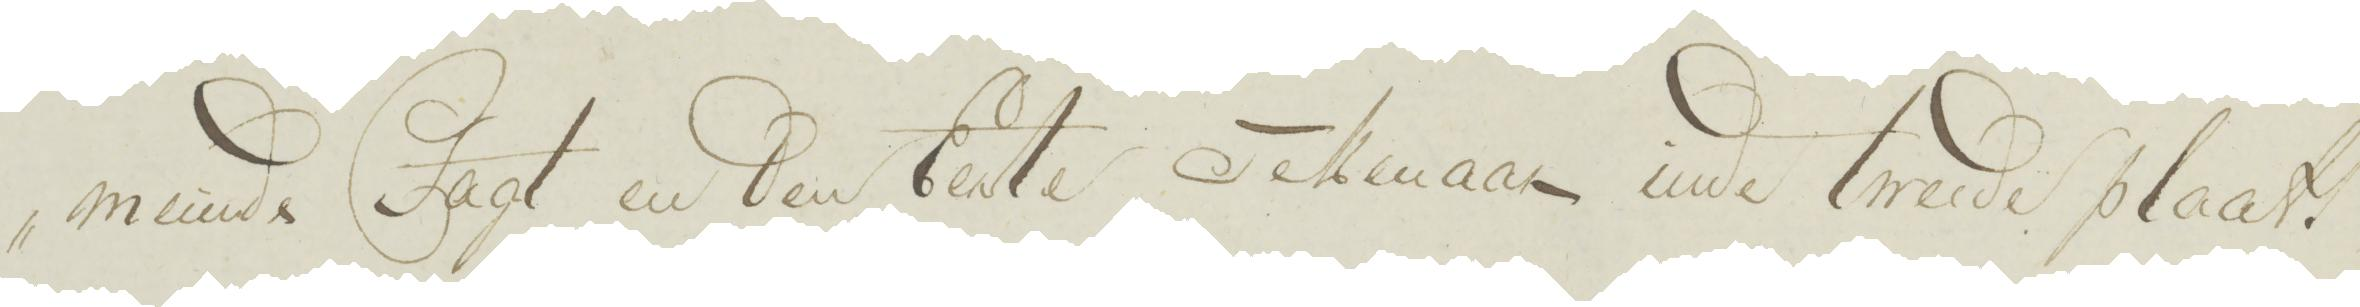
„menden Pagt en den Eerste Tekenaar inde tweede plaats
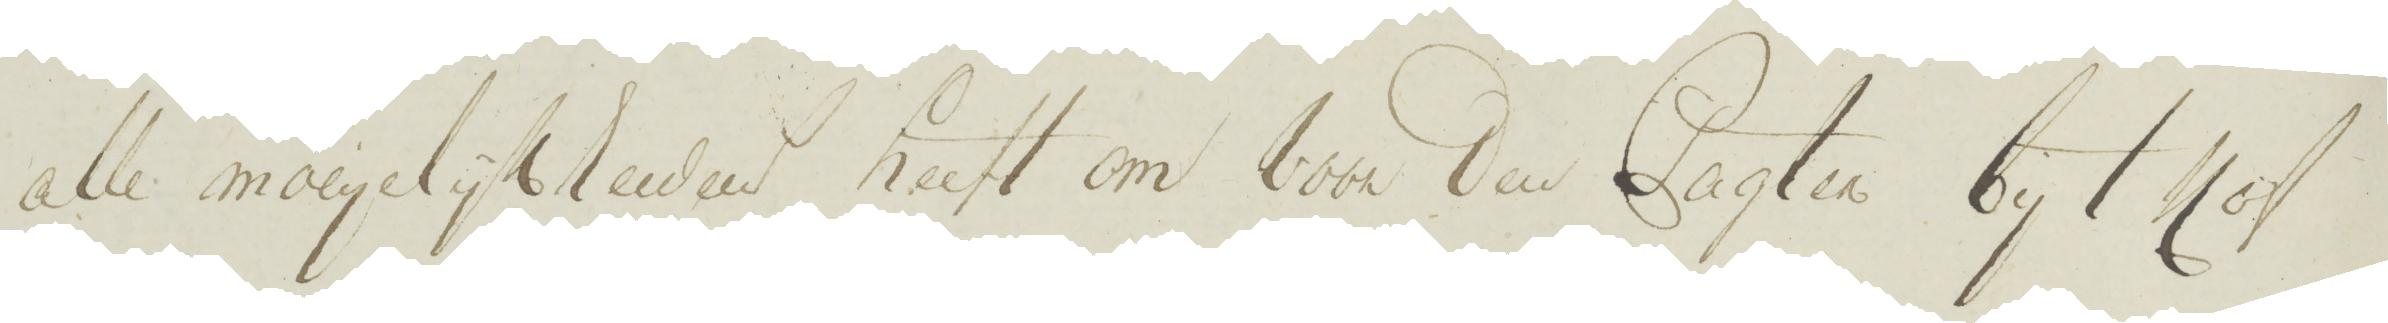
alle moeijelijkheeden heeft om voor den Pagter bij t Hof
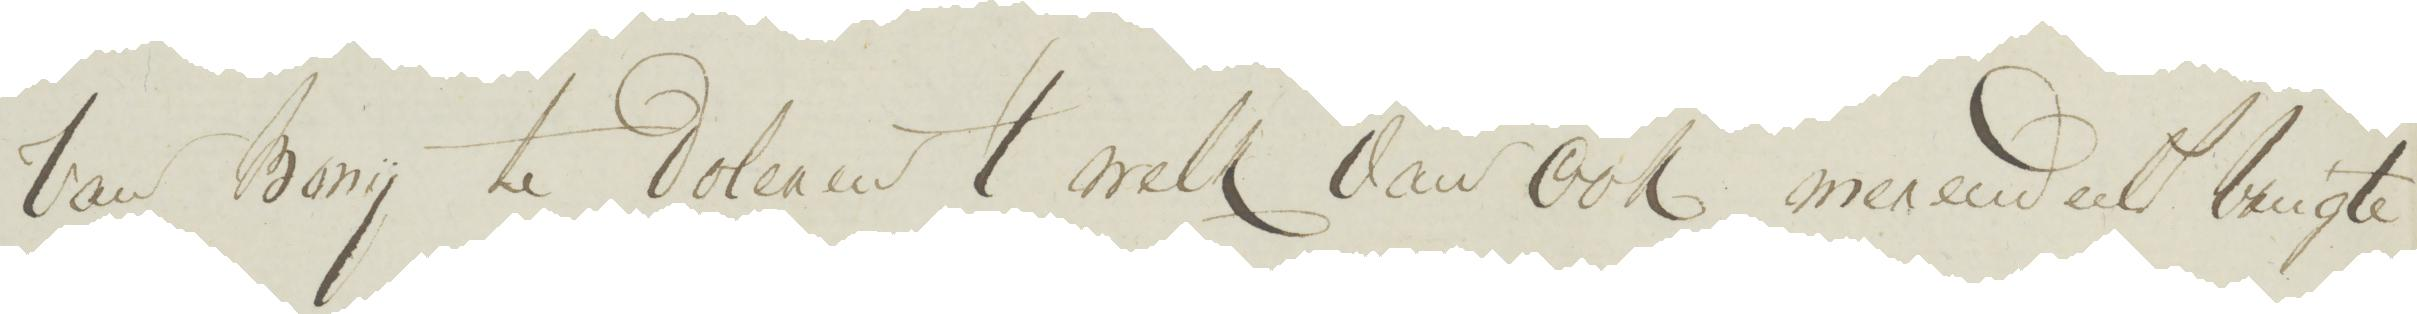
van Bonij te doleren ’t welk van ook merendeels vrugte,
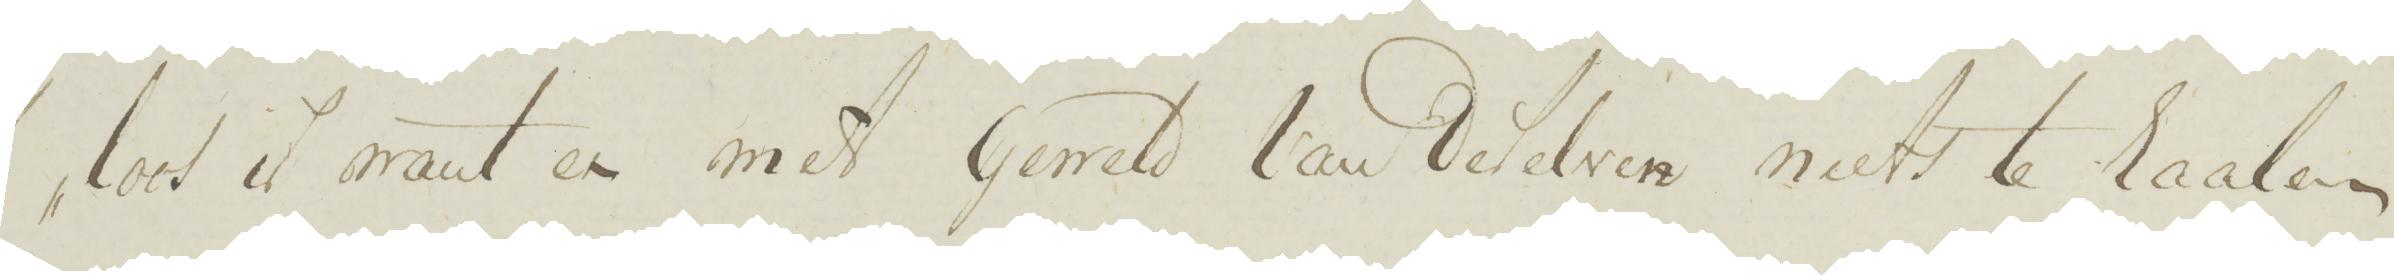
„loos is want er met geweld van deselven niets te haalen
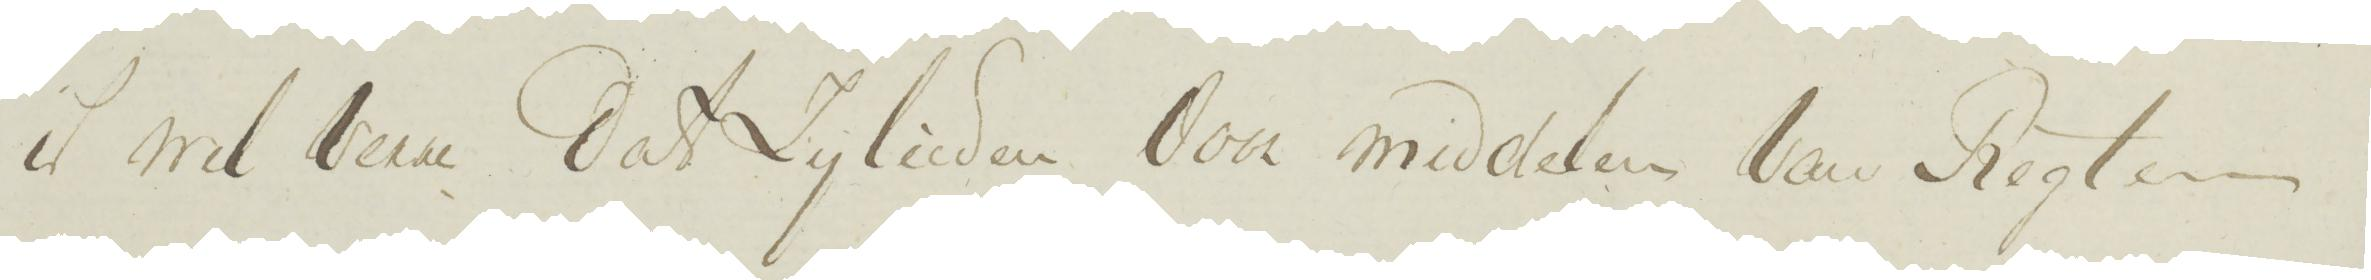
is wel verre dat zijlieden voor middelen van Regten
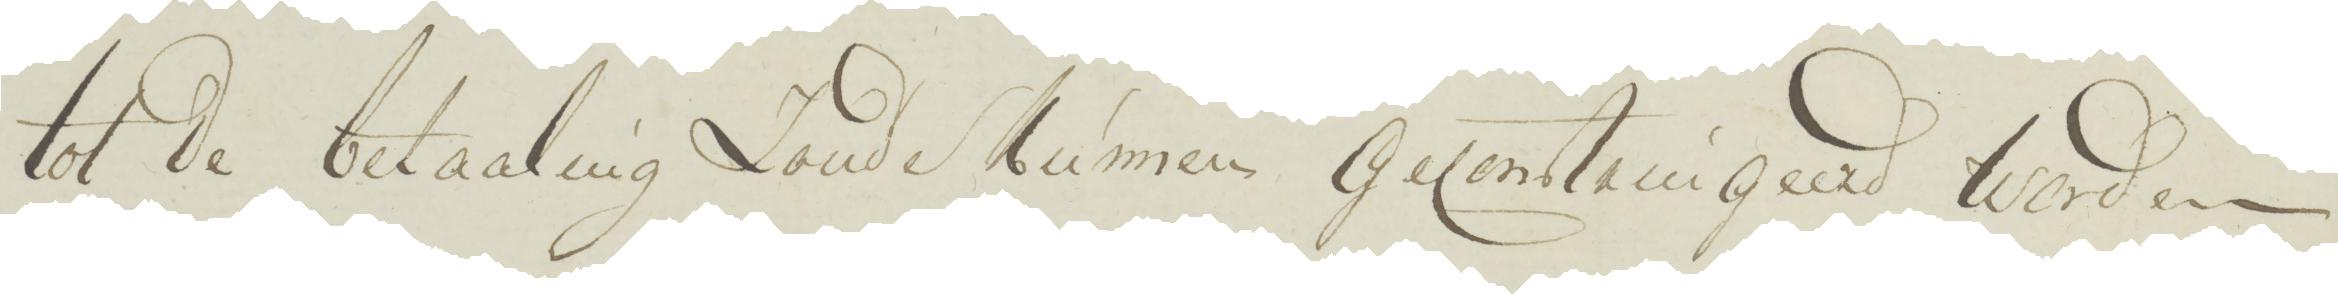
tot de betaaling zoude kumen gecontruigeerd worden
